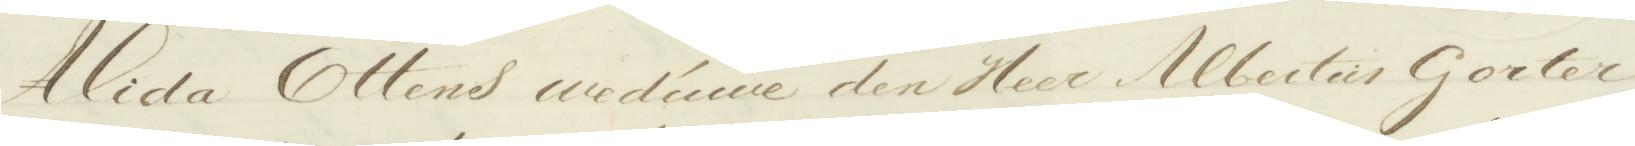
Alida Ottens weduwe den Heer Albertus Gorter
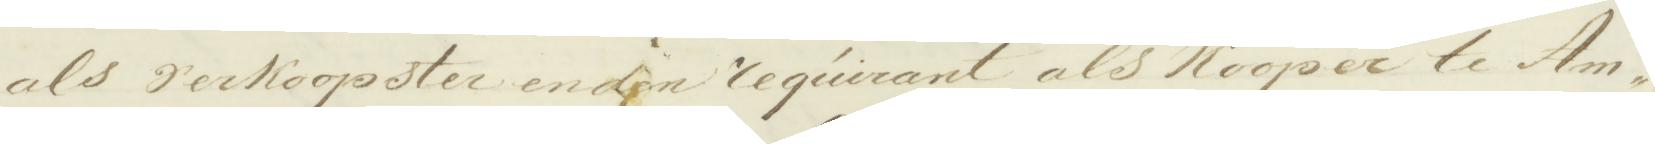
als verkoopster en den requirant als Kooper te Am„
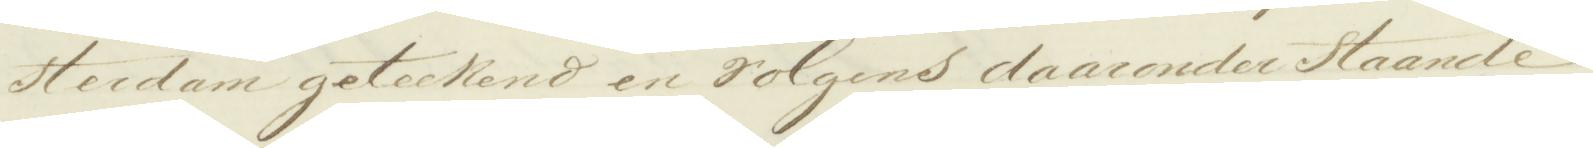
sterdam geteekend en volgens daaronder staande
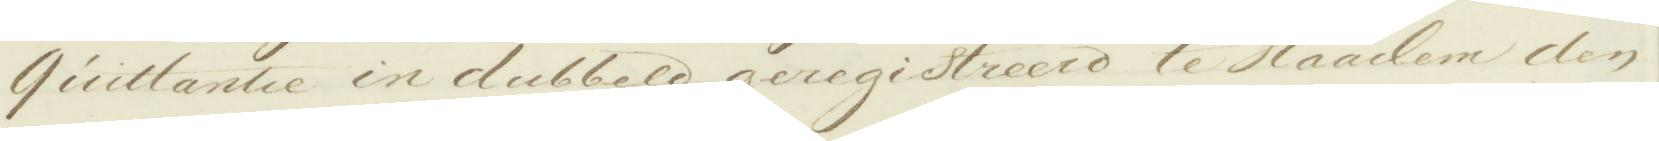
Quittantie in dubbeld geregistreerd te Haarlem den
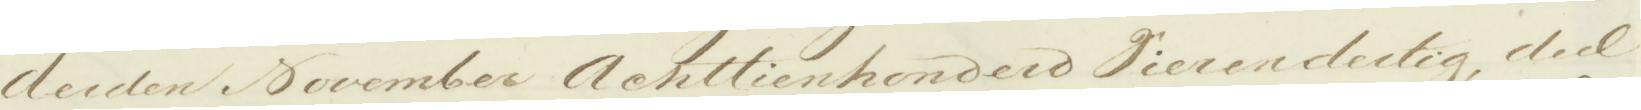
derden November Achttienhonderd Vieren dertig, deel
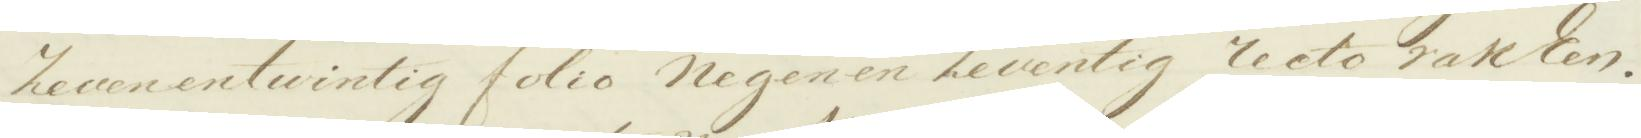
Zeven en twintig folio Negen en Zeventig recto vak Een.
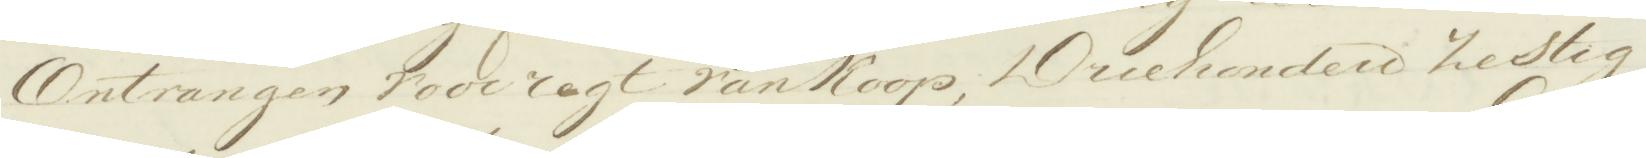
Ontvangen voor regt van Koop, Driehonderd Zestig
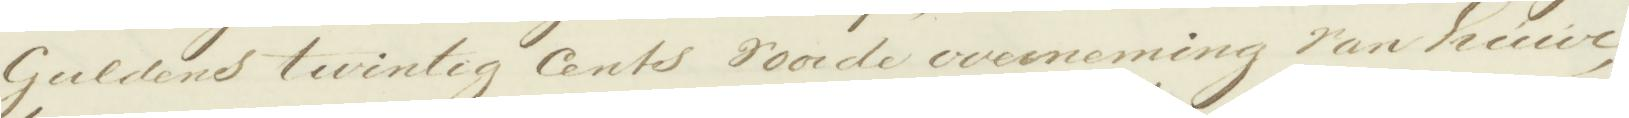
Guldens twintig cents voor de overneming van huur,
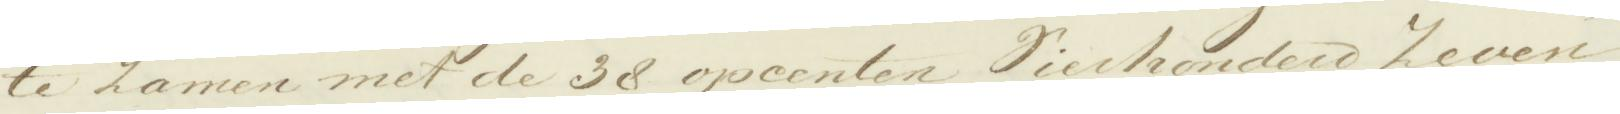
te zamen met de 38 opcenten, Vierhonderd Zeven
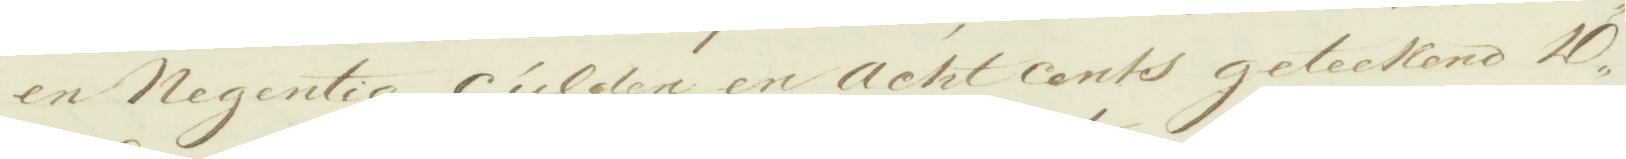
en Negentig Gulden en Acht cents geteekend D„
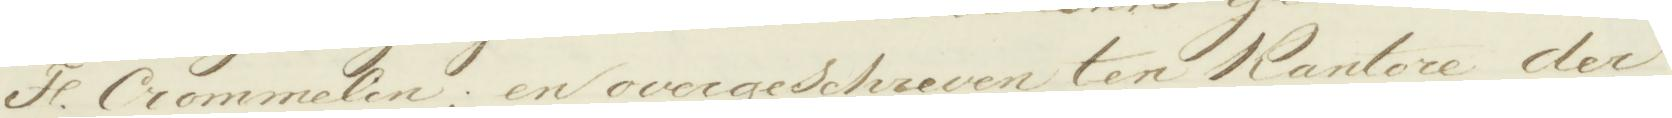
F. Crommelin, en overgeschreven ten Kantore der
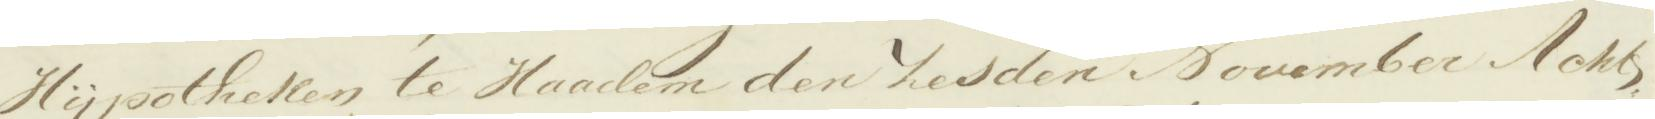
Hijpotheken te Haarlem den zesden November Acht
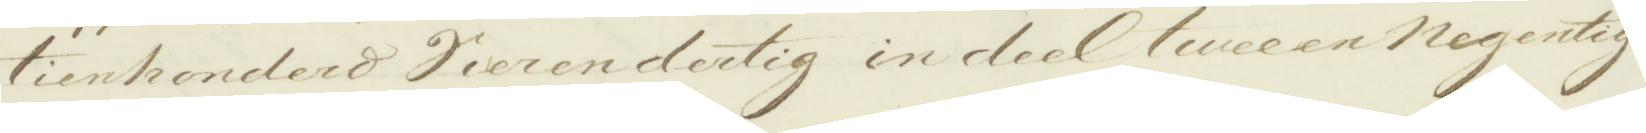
tienhonderd Vieren dertig in deel twee en Negentig
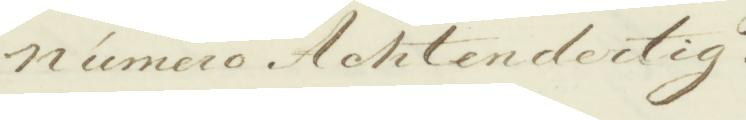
numero Achtendertig
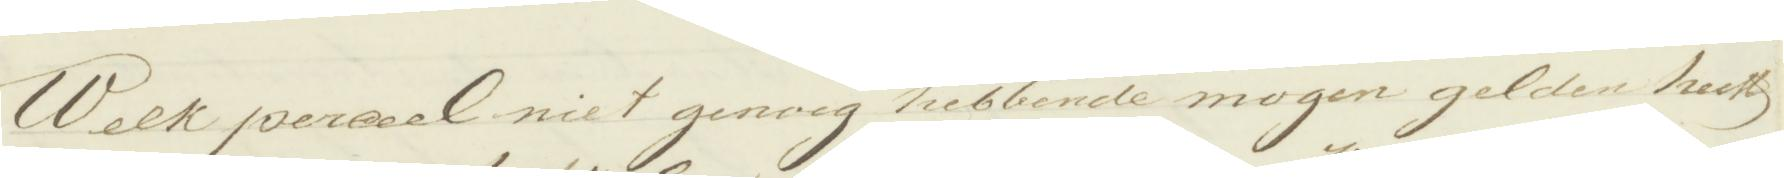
Welk perceel niet genoeg hebbende mogen gelden heeft
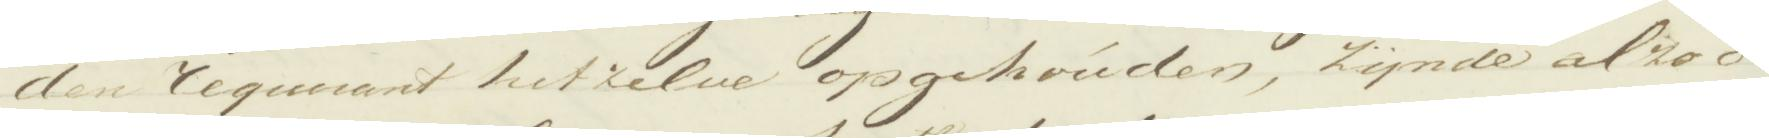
den requirant hetzelve opgehouden, zijnde alzoo
